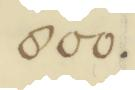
800.
